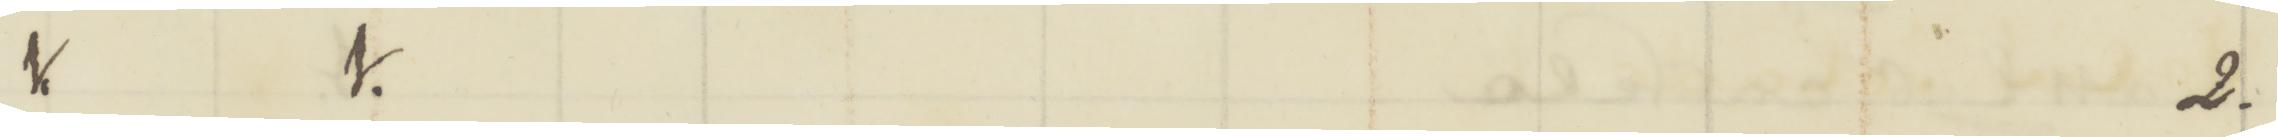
1. 1. 2.
